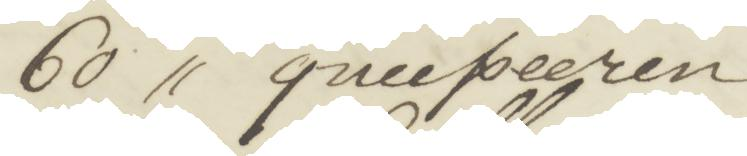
60 „ queepeeren
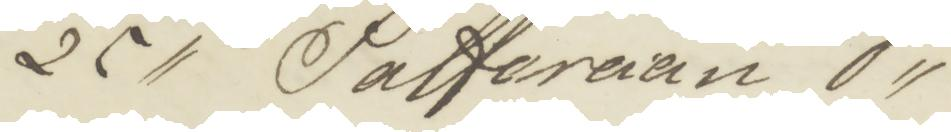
25 „ safferaan d„o
